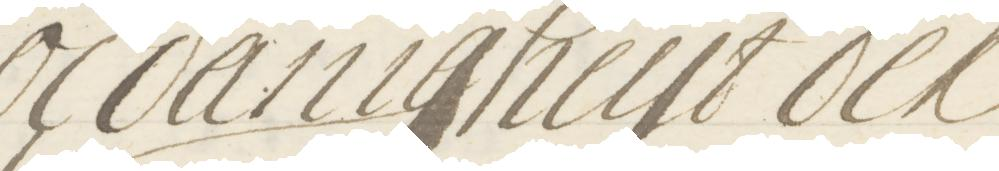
Hoedanigheijt der
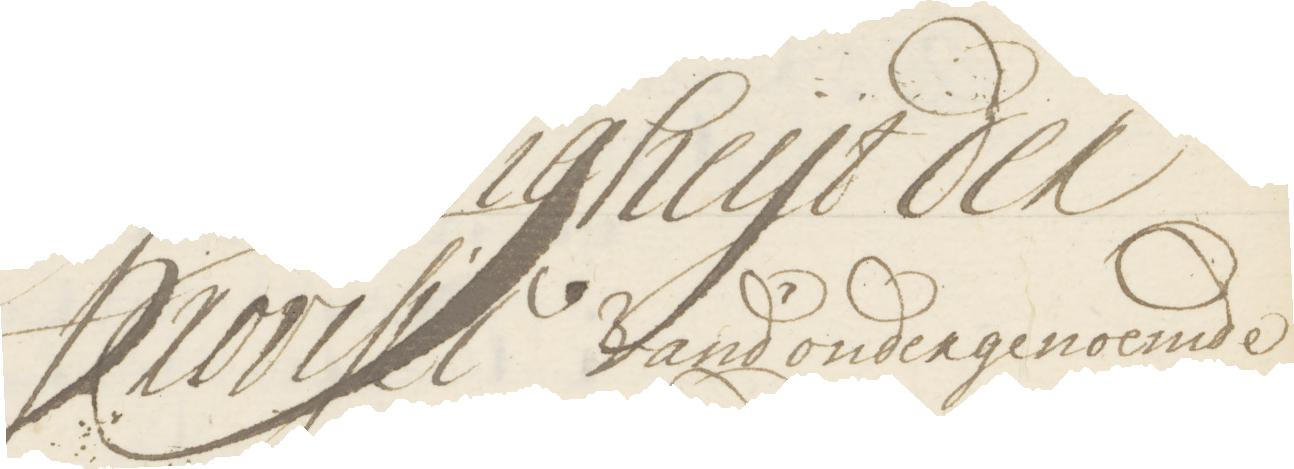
provisie vand' ondergenoemde
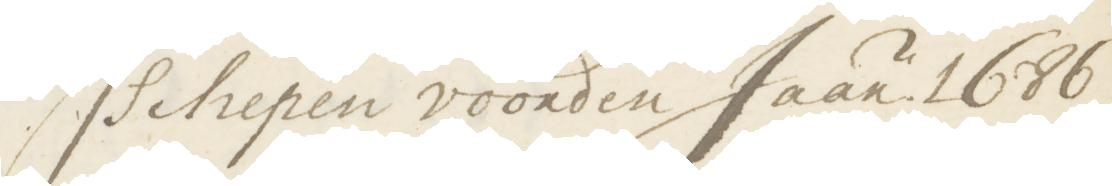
schepen voorden Jaar 1686
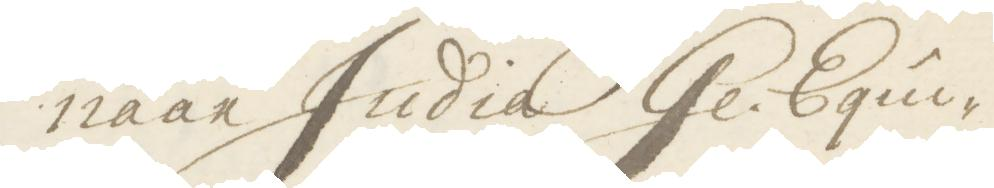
naar Jndia Ge. Equi„
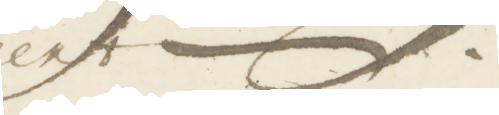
peert
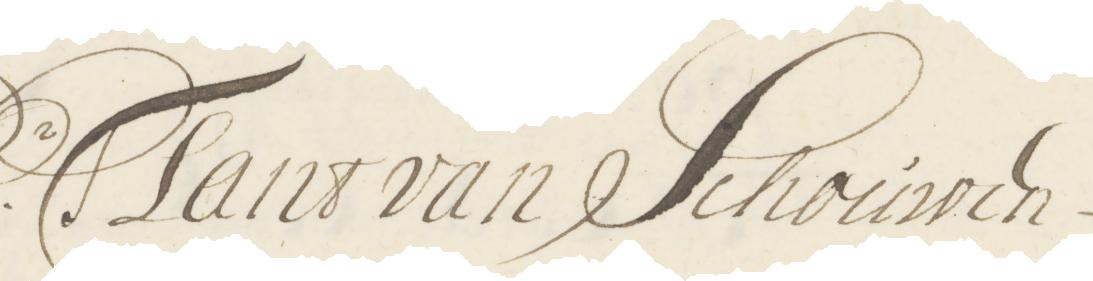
'T Lant van Schouwen
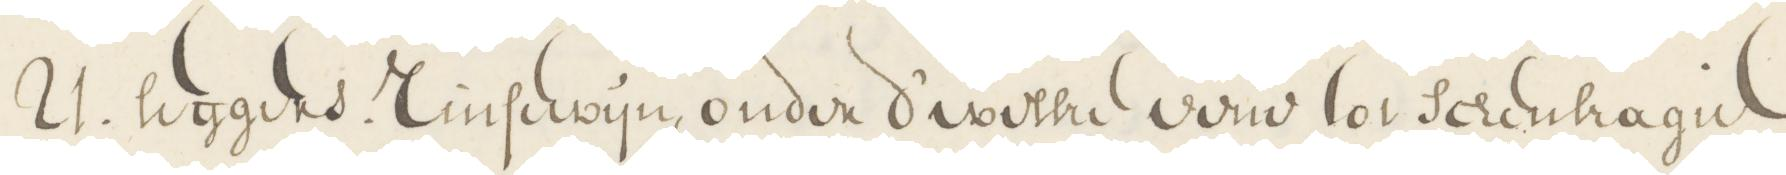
21. leggers. rinsewijn, onder d'welke eene tor schenkagie
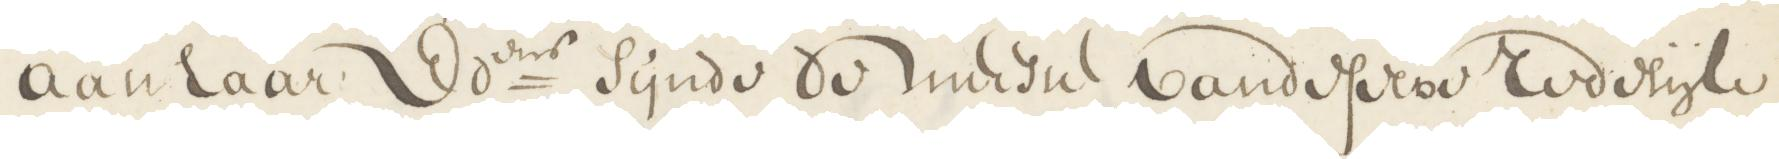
aan haar Ed=ens sijnde de meeste van deselve redelijk
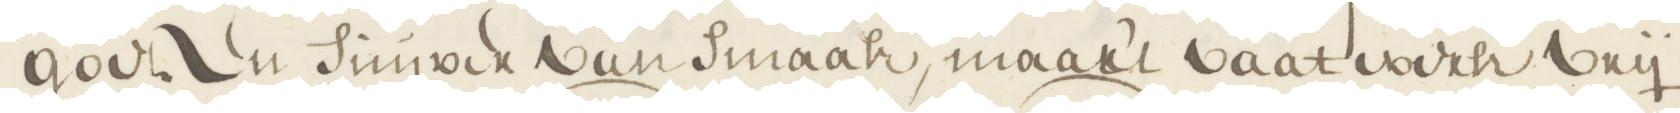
goet en suijver van smaak, maar't vaatwerk vrij
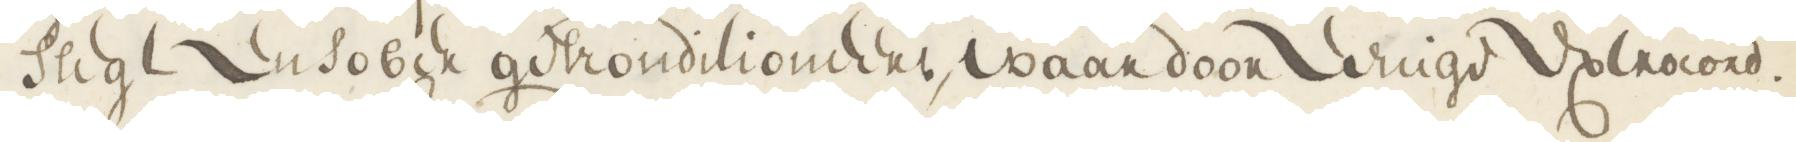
slegt en sober gekonditioneert, waar door Eenige Extraord.
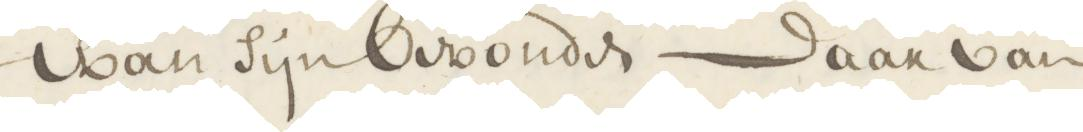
van sijn bevonde daar van
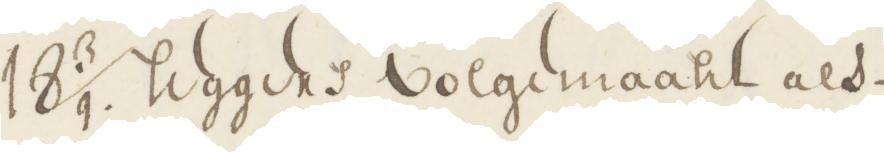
18¾. leggers volgemaakt als
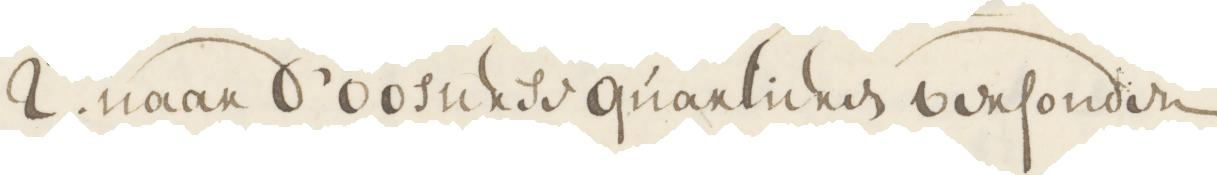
2. naar d’oosterse quartieren versonden
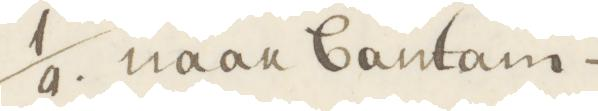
¼. naar bantam
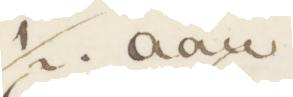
½. aan
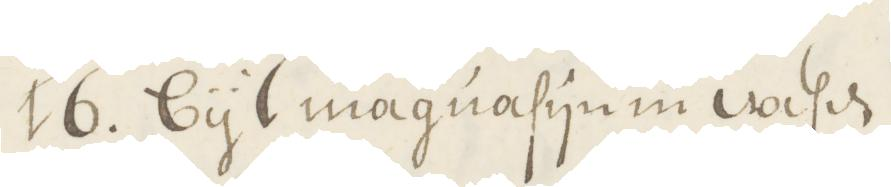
16. bijl maguasijn in wesen
